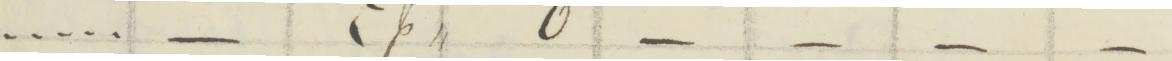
. . . . . — 5 p„ls 6 — — — —
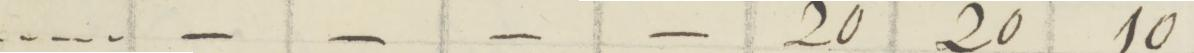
. . . . . — — — — 20 20 10
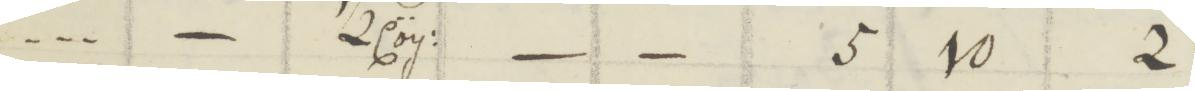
. . . — ½ Coij:s — — 5 10 2
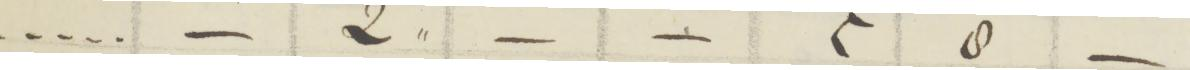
. . . . — 2 „ — — 5 8 —
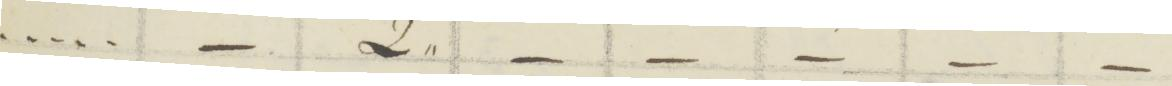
. . . . . — 2 „ — — — — —
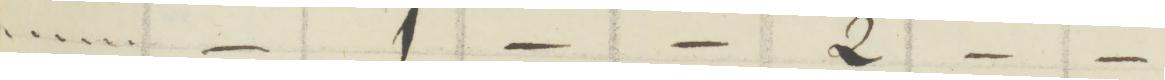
. . . . . . — 1 — — 2 — —
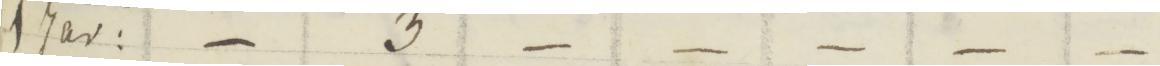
1 Jav: — 3 — — — — —
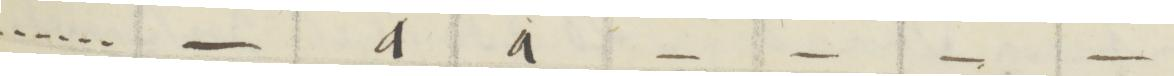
. . . . . — 4 4 — — — —
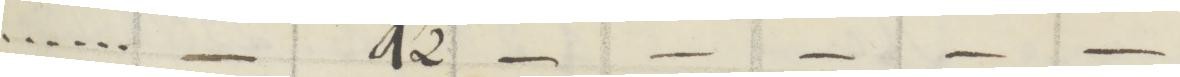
. . . . . . — 4½ — — — — —
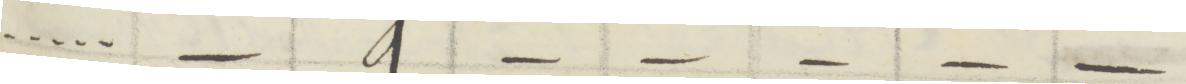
. . . . . — 4 — — — — —
